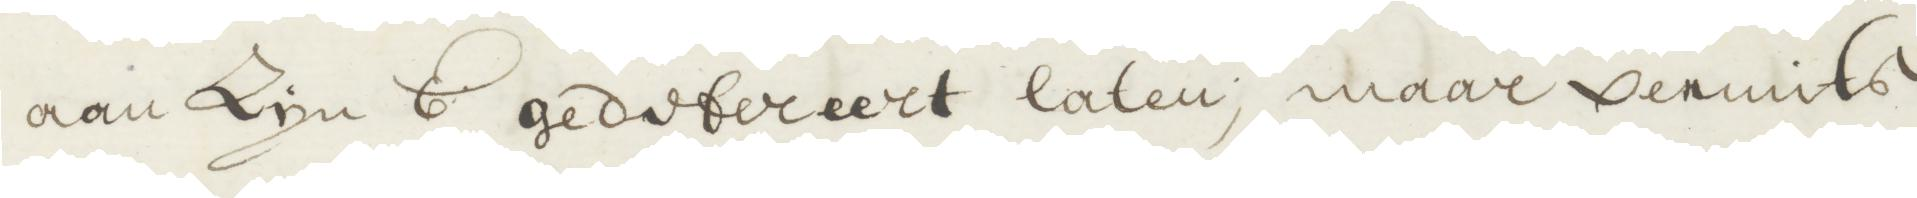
aan zijn E gedefereert laten; maar vermits
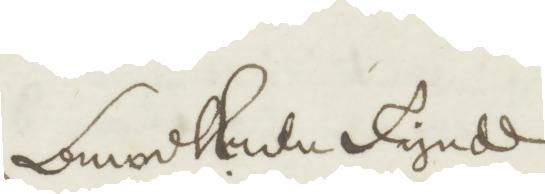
tenwelken Eijnde
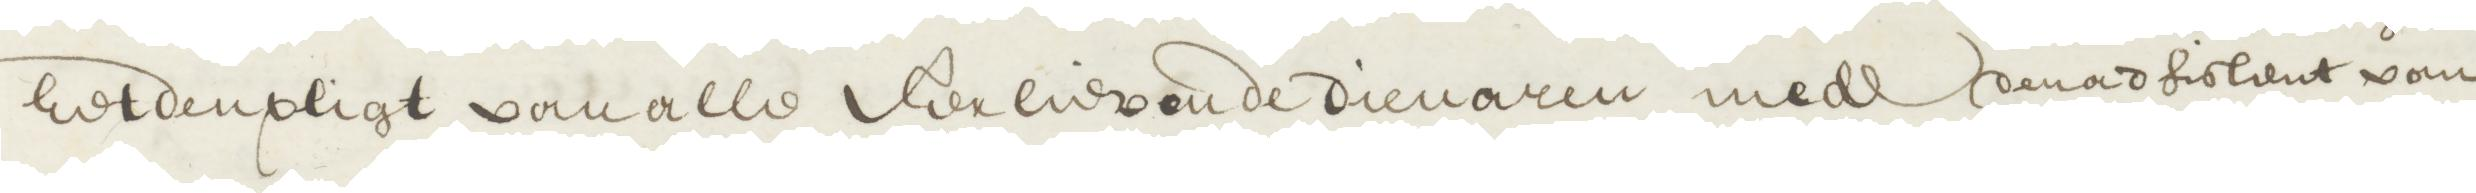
het den pligt van alle Eerlievende dienaren mede den adsistent van
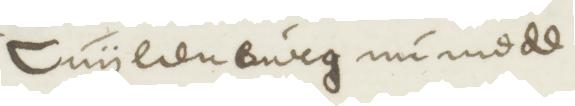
Cuijlenburg nu mede
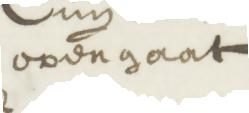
overgaat.
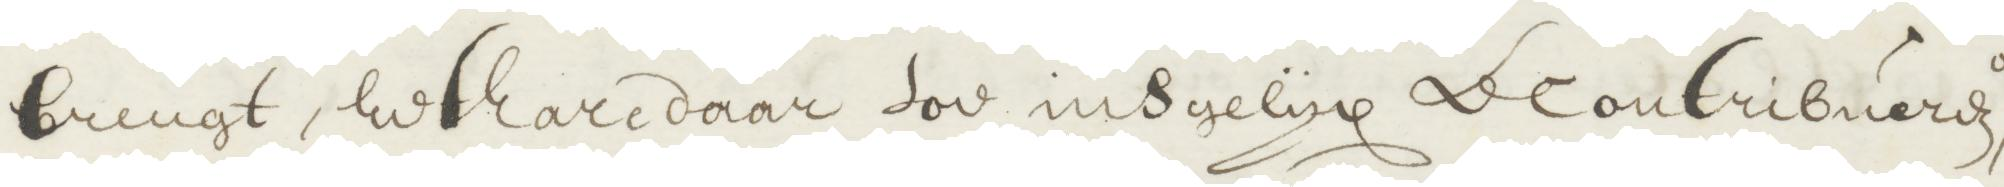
brengt, het hare daar toe insgelijx te contribueren,
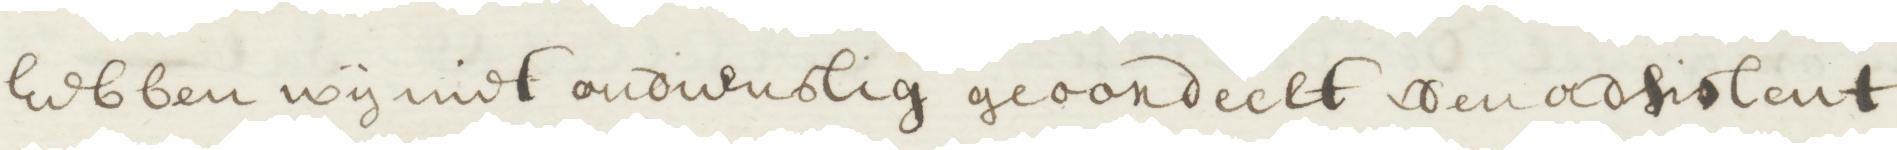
hebben wij niet ondienstig geoordeelt den adsistent
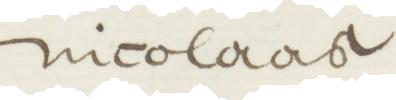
nicolaas
